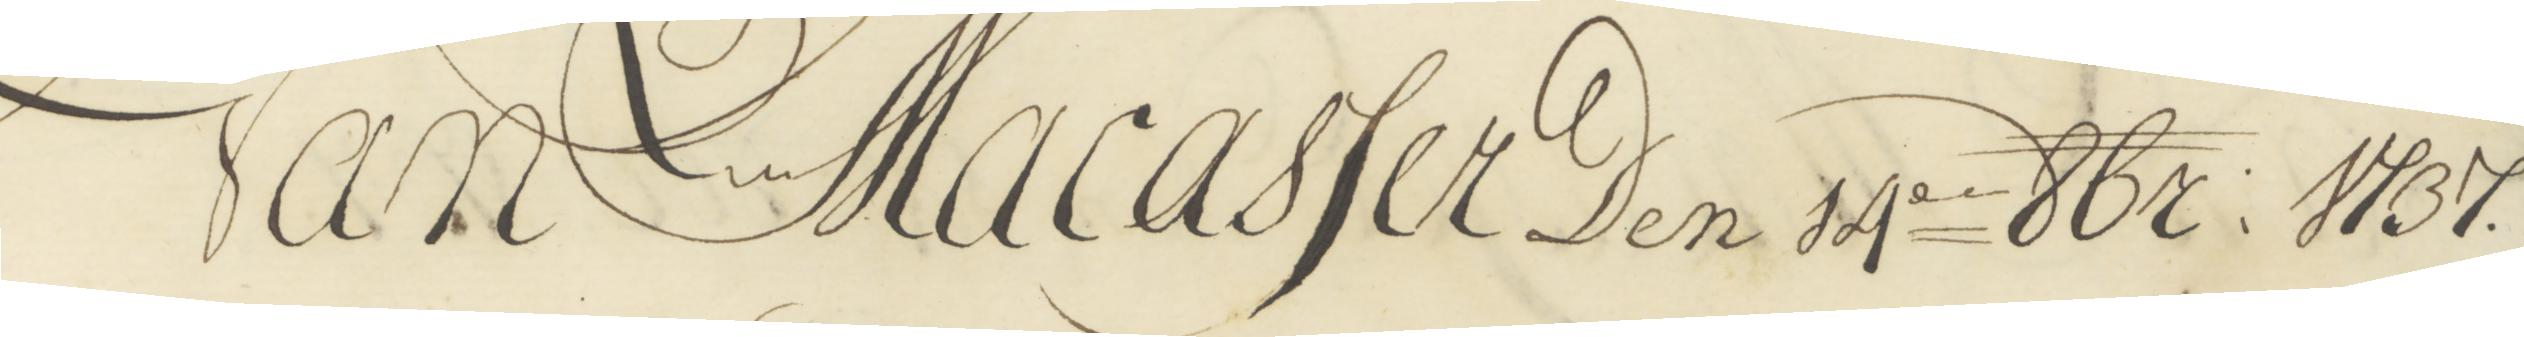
Van Macasser Den 14=en 8br: 1737.
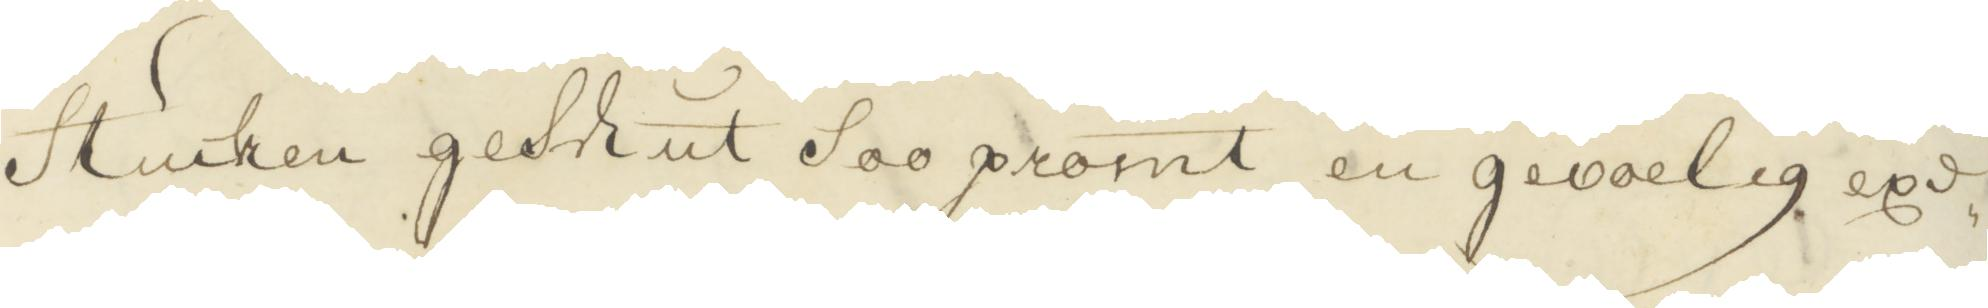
stucken geschut soo promt, en gevoelig exe„
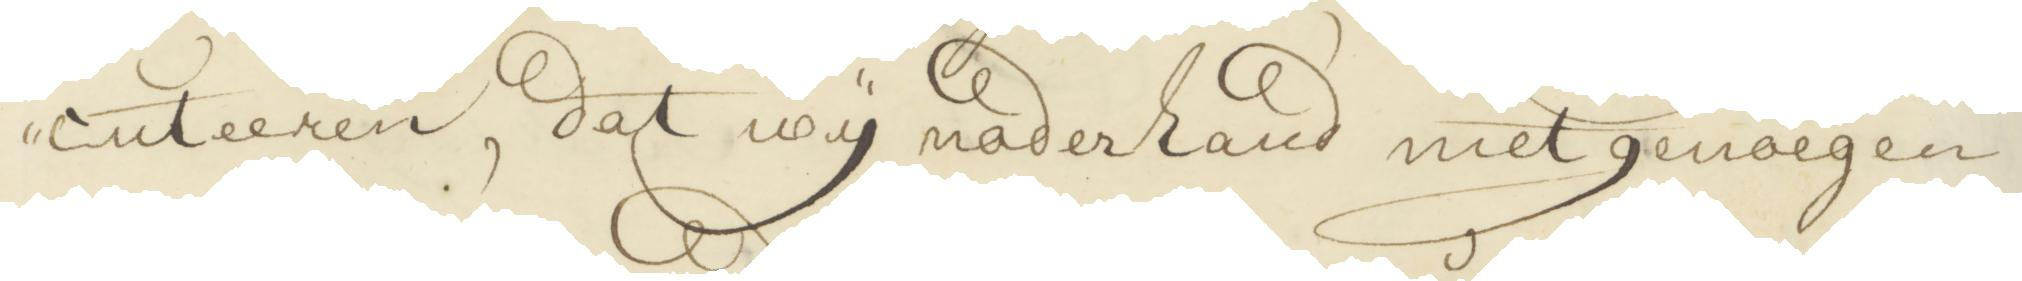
„cuteeren, dat wij naderhand met genoegen
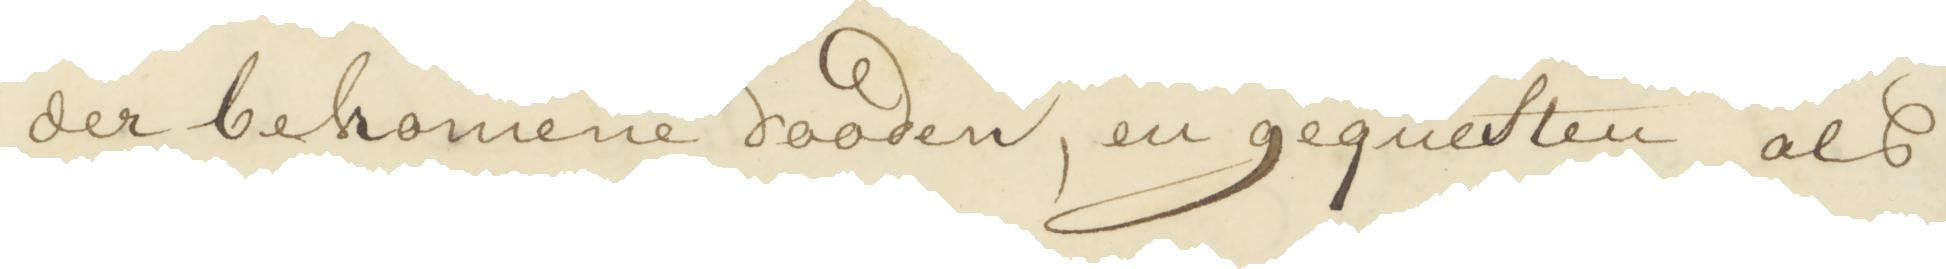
der bekomene dooden, en gequesten, als
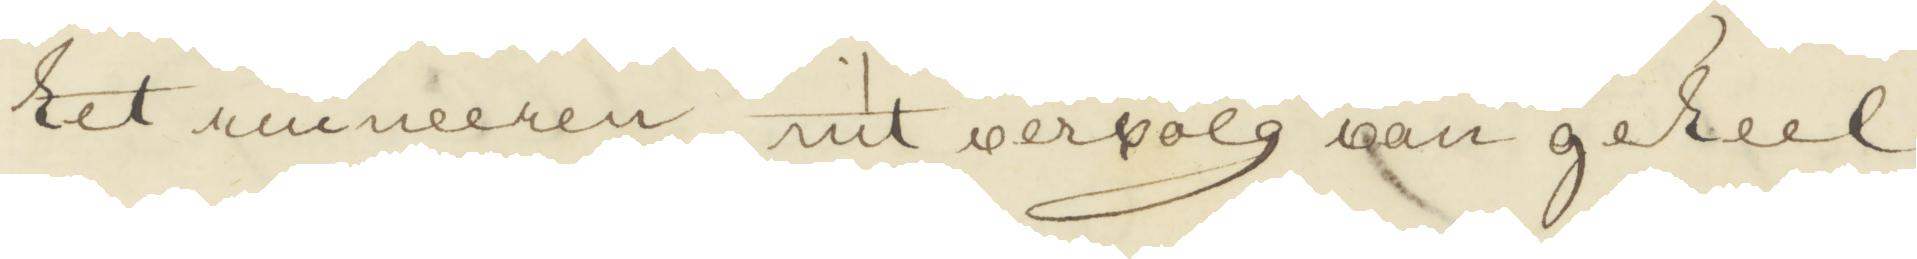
het ruineeren, in't vervolg van geheel
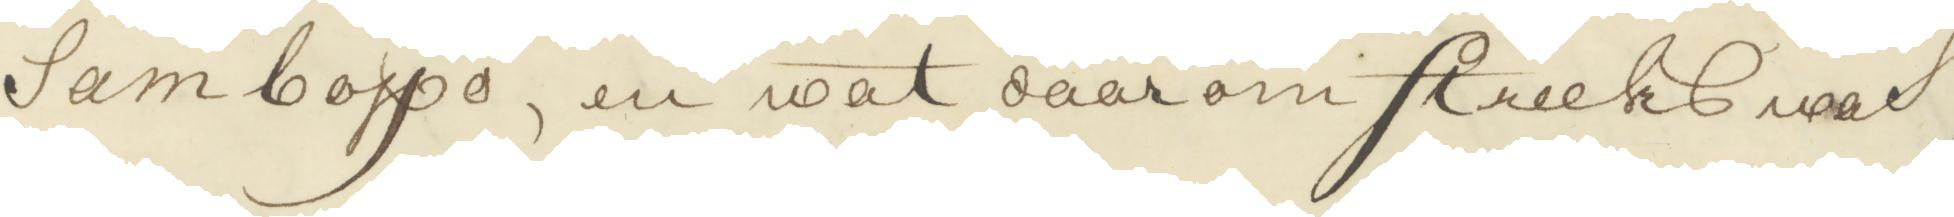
sam boppo, en wat daar om streeks was,
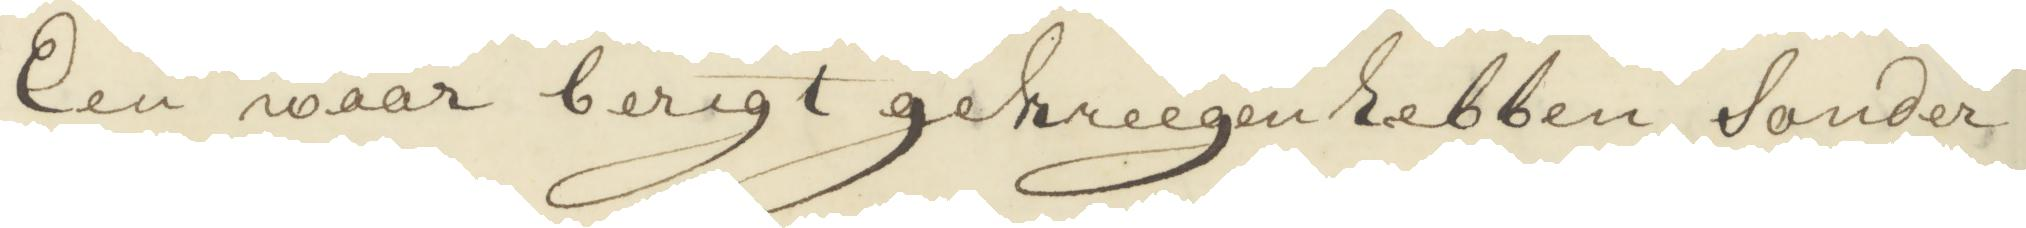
Een waar berigt gekreegen hebben, sonder
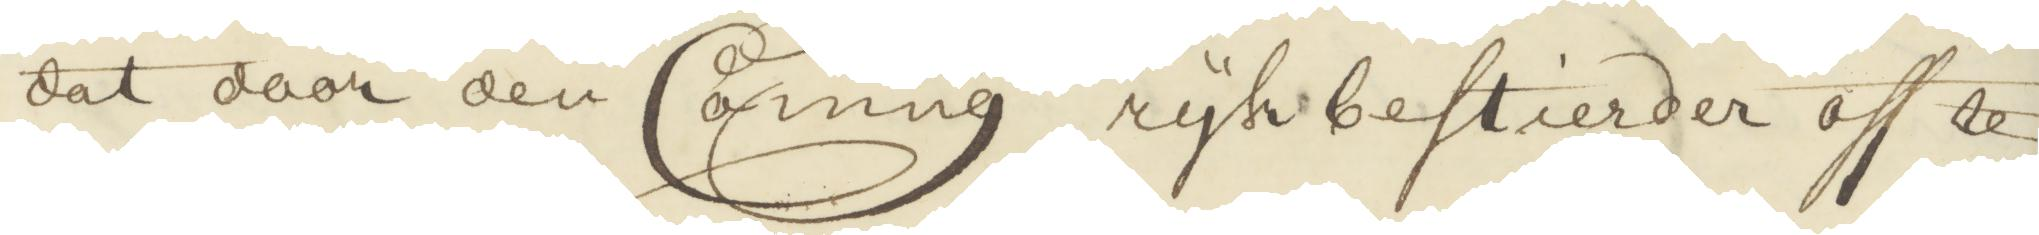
dat door den Coning, rijk bestierder off te
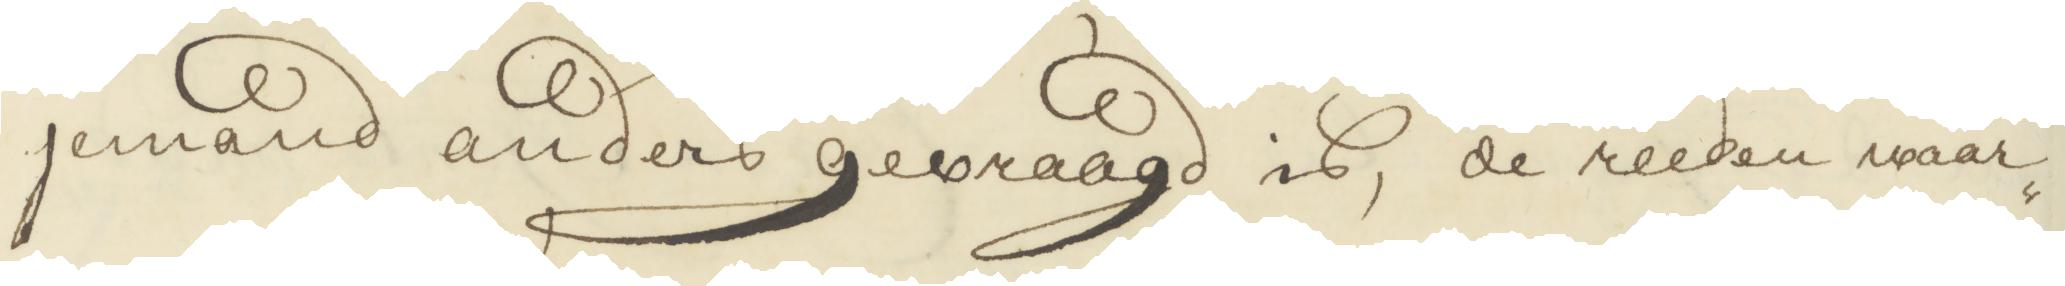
jemand anders gevraagd is, de reeden waar„
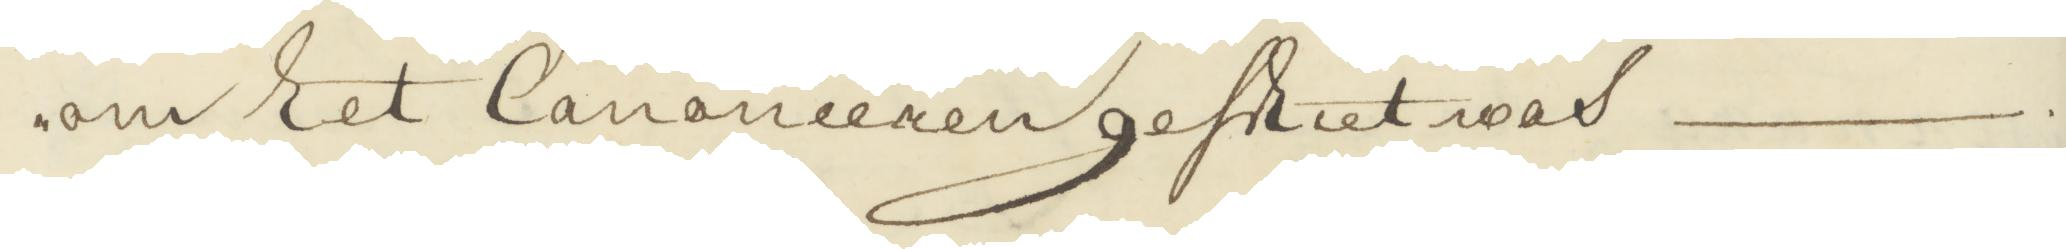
„om het Canoneeren geschiet was —.
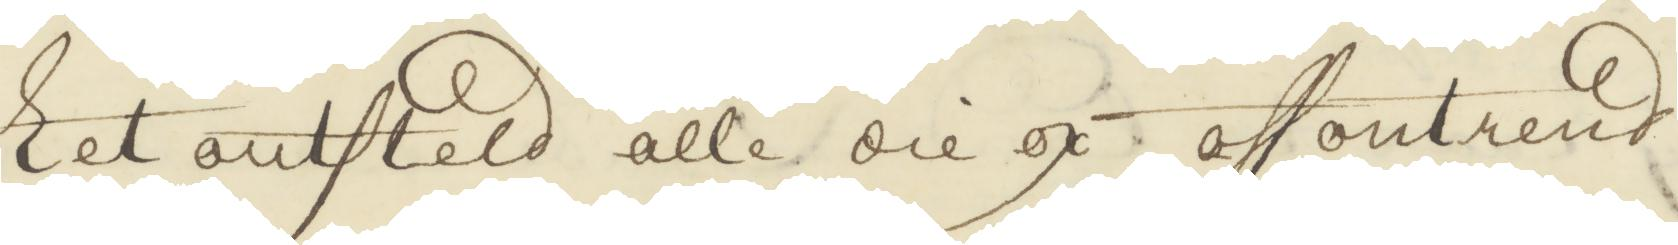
het ontsteld alle die op, off ontrend
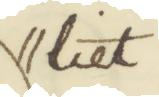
„liet
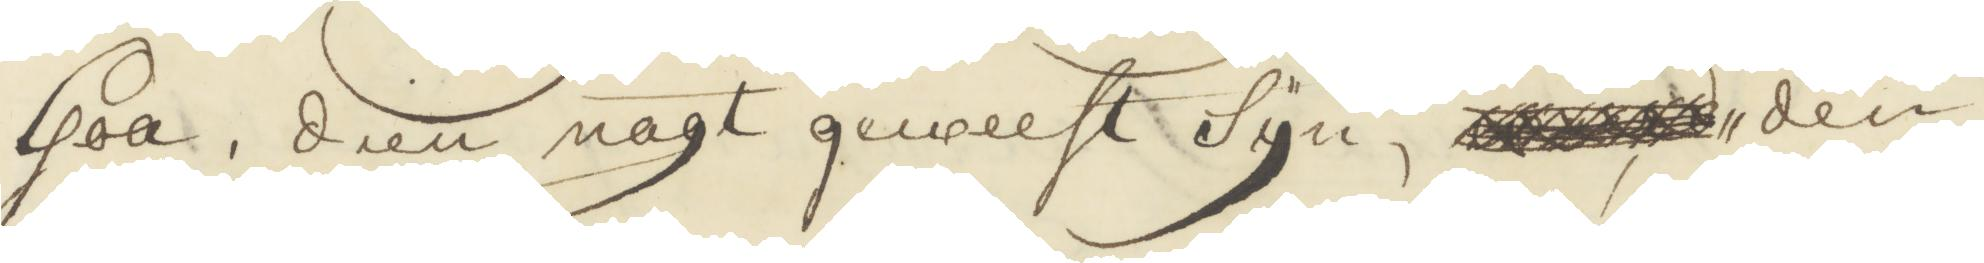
Goa, dien nagt geweest sijn, „den
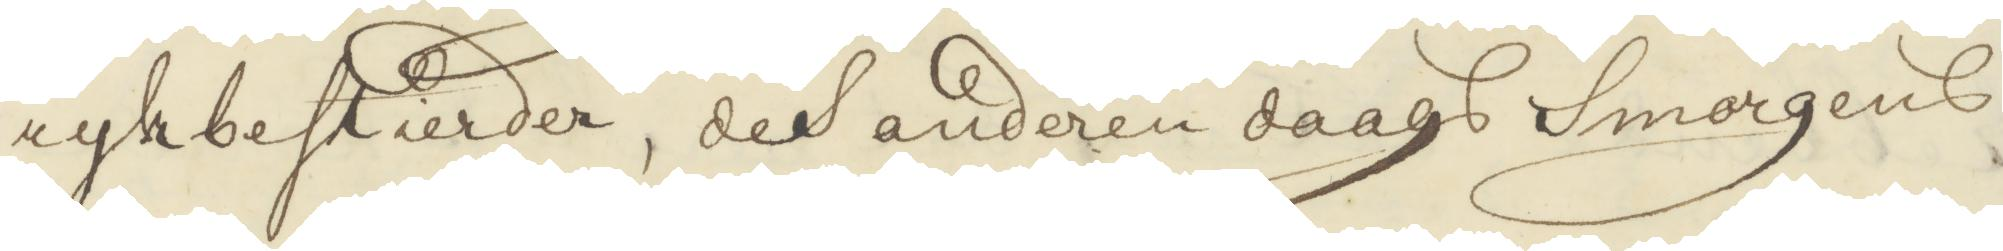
ryk bestierder, des anderen daags 'smorgens
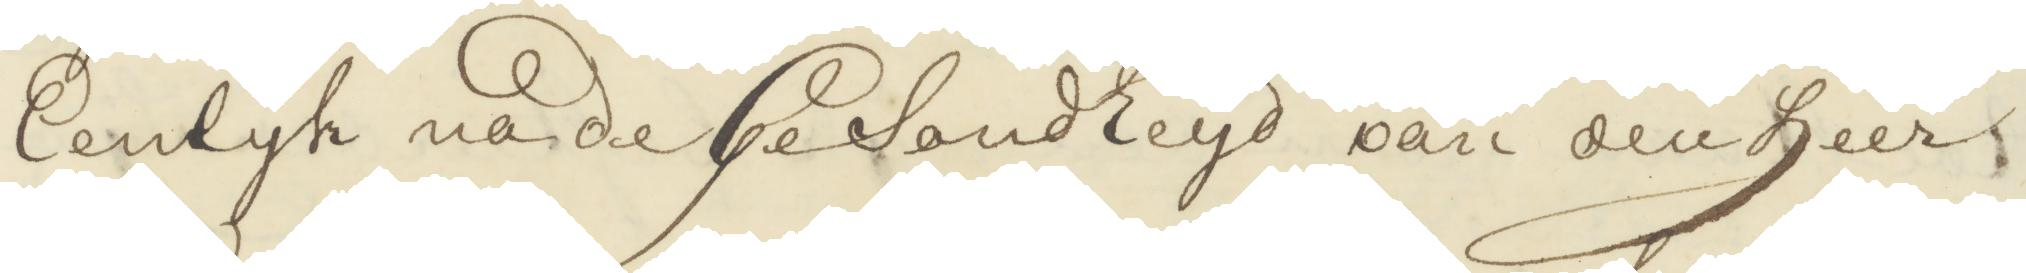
Eenlijk na de Gesondheijd van den heer
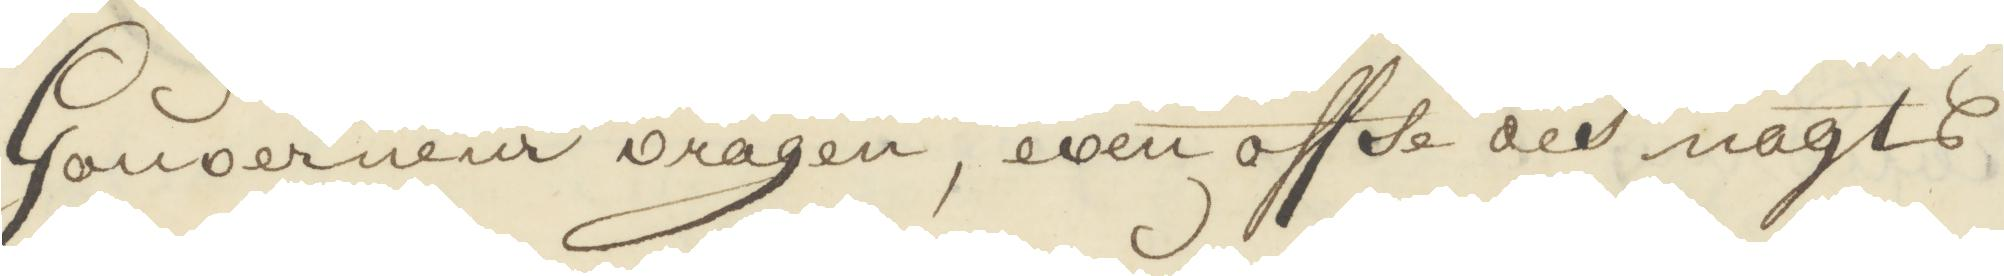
Gouverneur vragen, even offse des nagts
